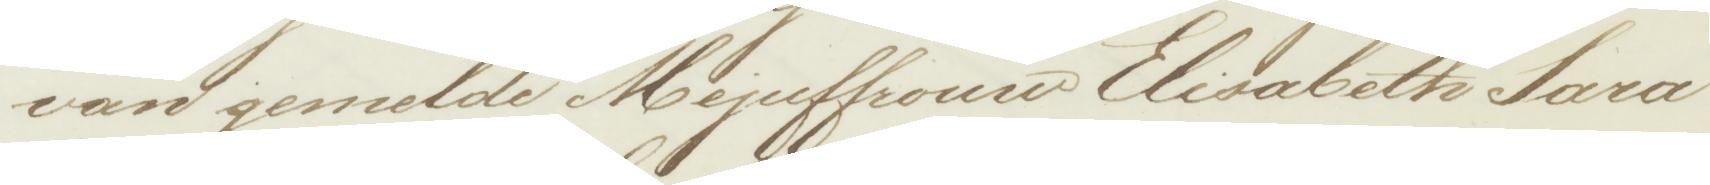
van gemelde Mejuffrouw Elisabeth Sara
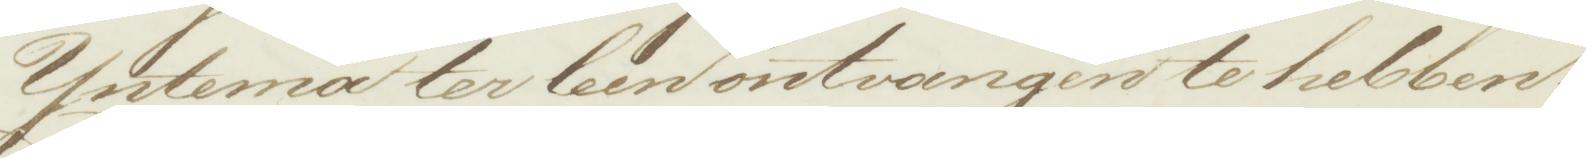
Yntema ter leen ontvangen te hebben.
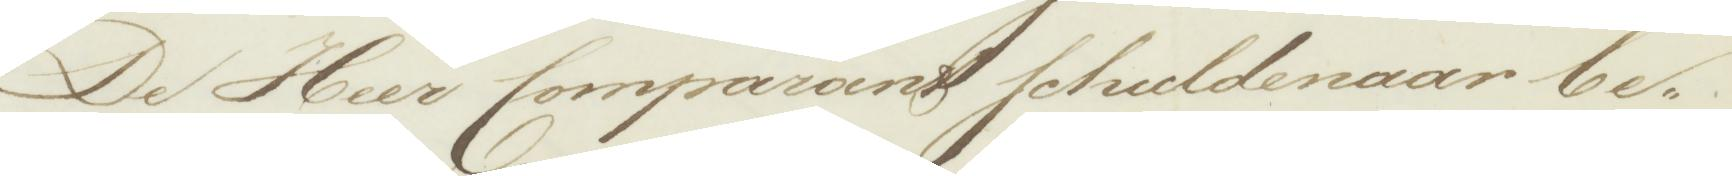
De Heer Comparant schuldenaar be„
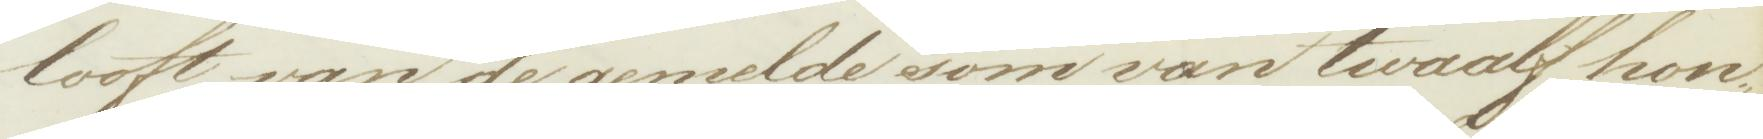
looft van de gemelde som van twaalf hon„
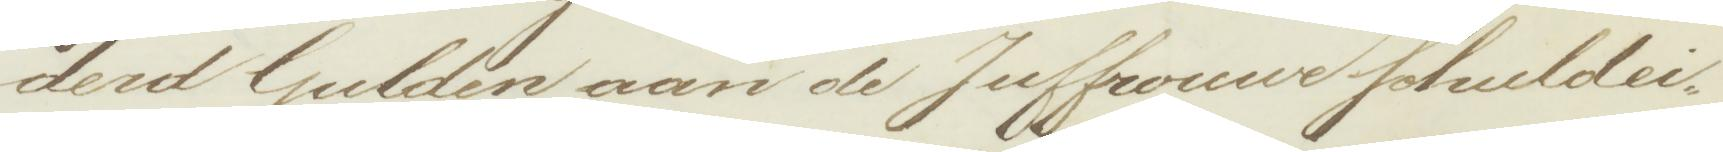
derd Gulden aan de Juffrouwe schuldei„
